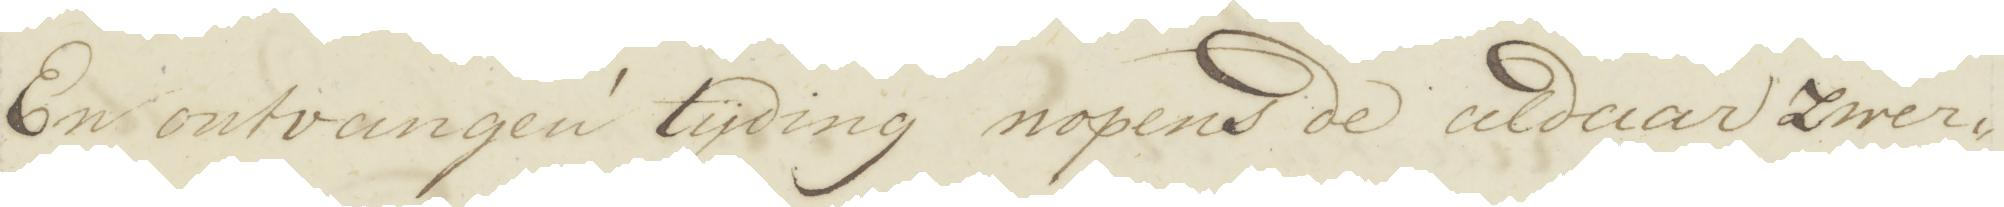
En ontvangen tijding nopens de aldaar zwer„
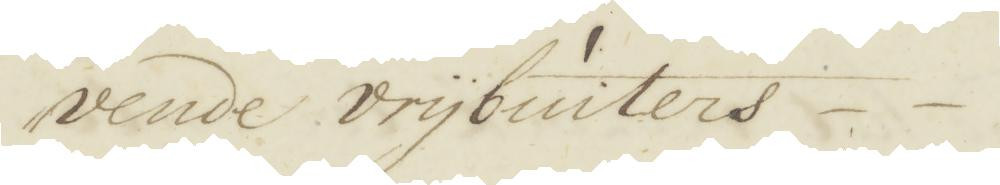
„vende vrijbuiters - -
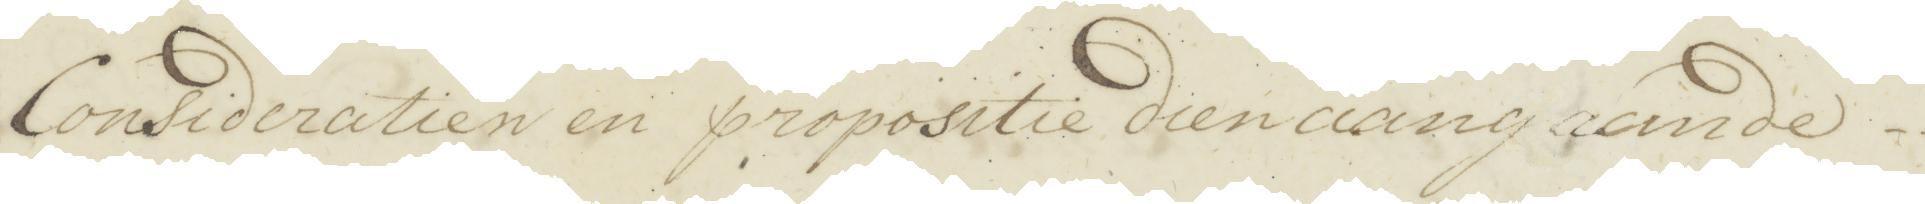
Consideratien en propositie dien aangaande -
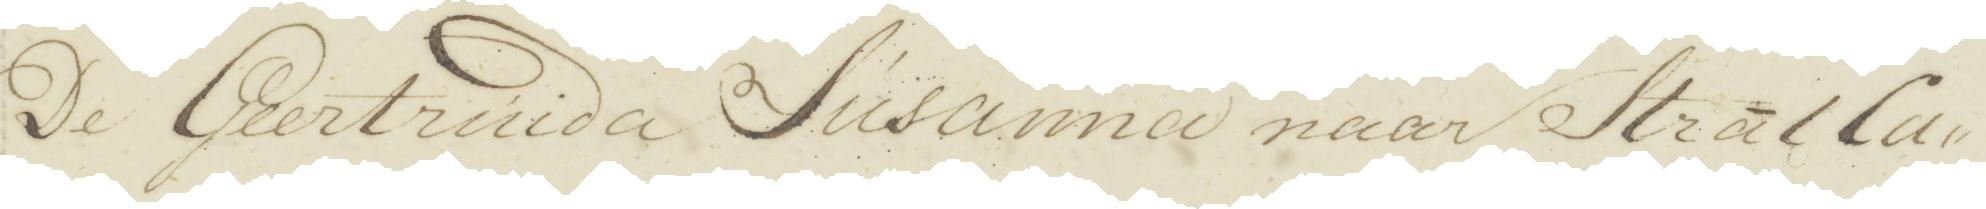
De Geertruida Susanna naar Strat Ca„
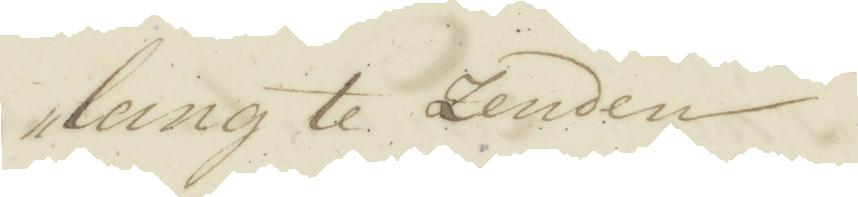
„lang te zenden
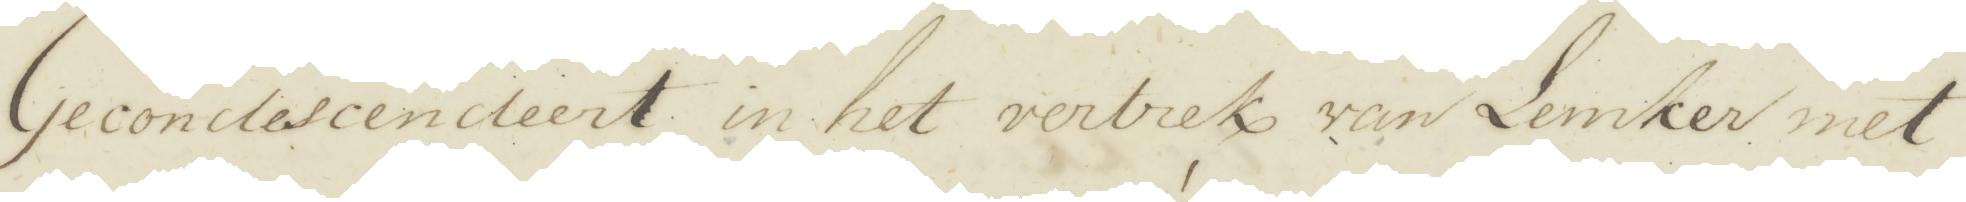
Gecondescendeert in het vertrek van Lemker met
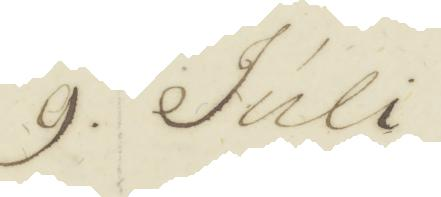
9. Iuli
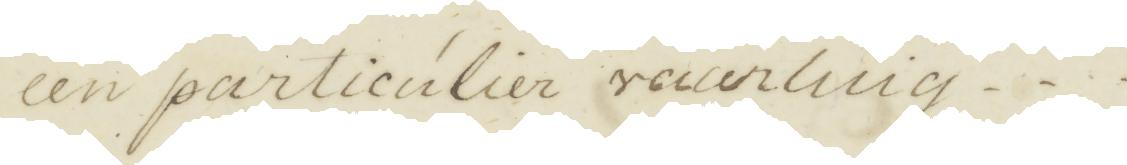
een particulier vaartuig - -
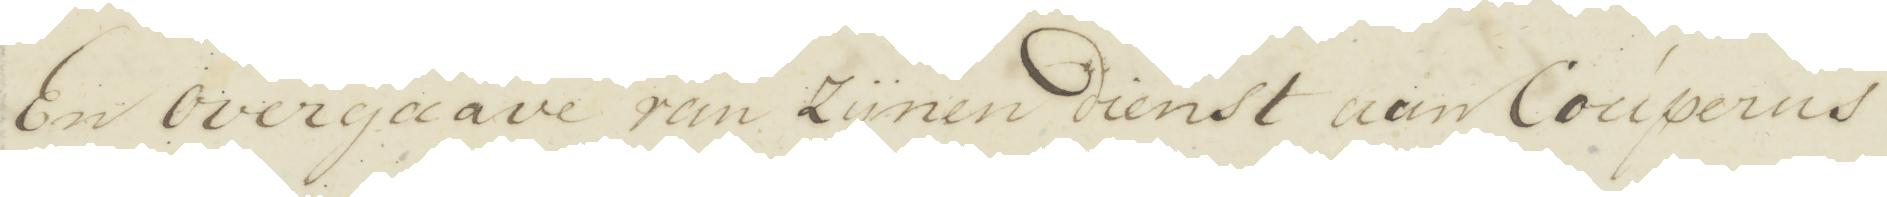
En overgaave van zijnen dienst aan Couperus
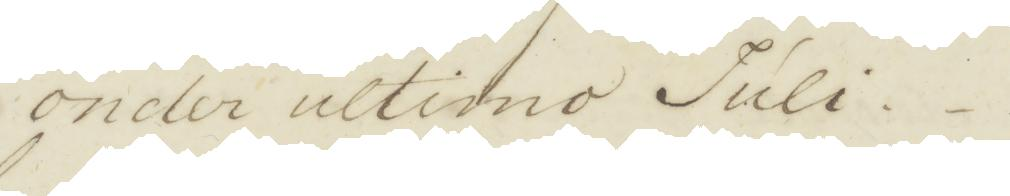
onder ultimo Iuli. -
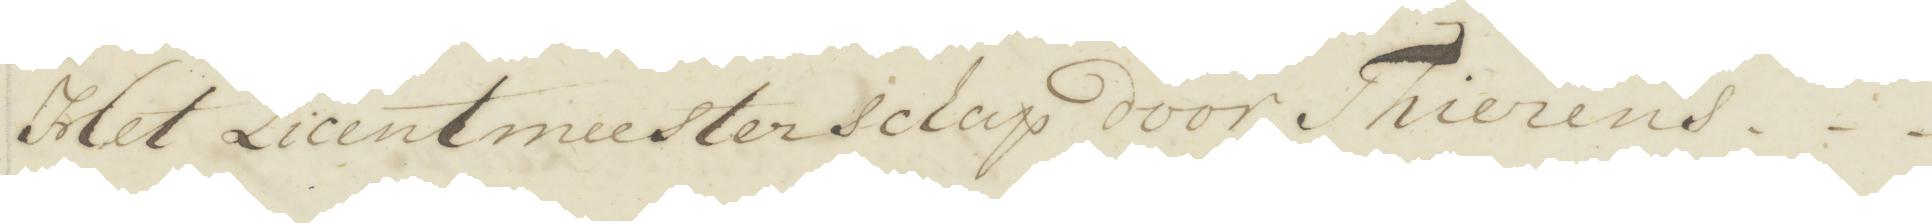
Het Licentmeesterschap door Thierens. - - -
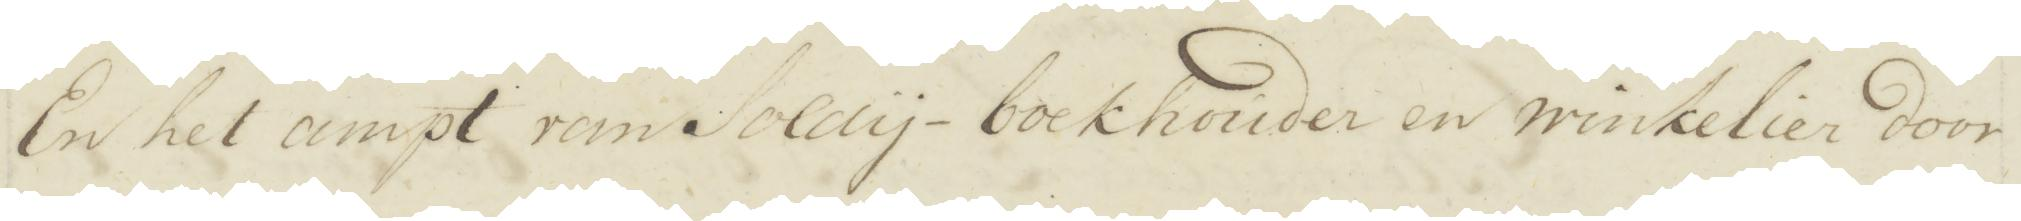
En het ampt van Soldij-boekhouder en winkelier door
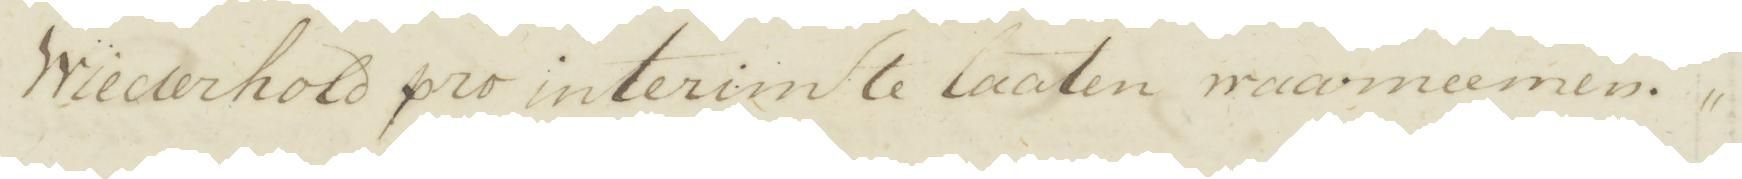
Wiederhold pro interim te laaten waarneemen. „
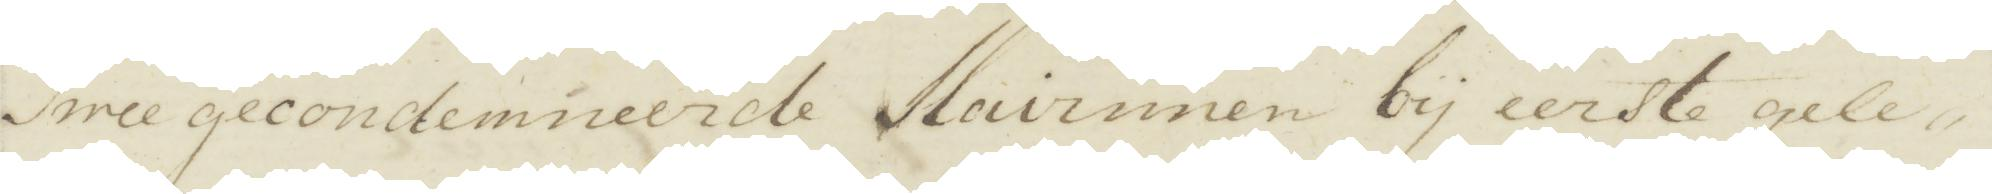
Twee gecondemneerde slavinnen bij eerste gele„
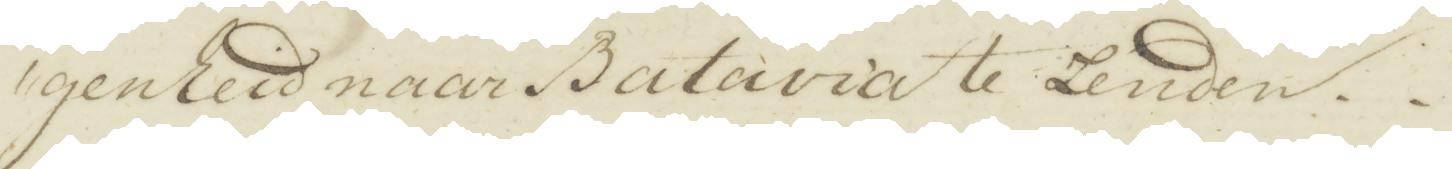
„genheid naar Batavia te zenden- -
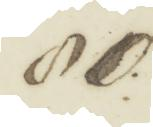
80:
